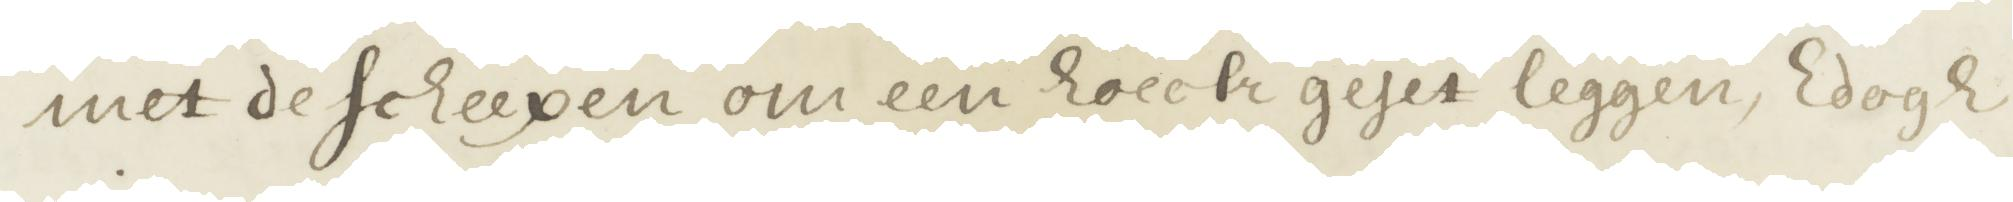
met de scheepen om een hoeck geset leggen, Edogh
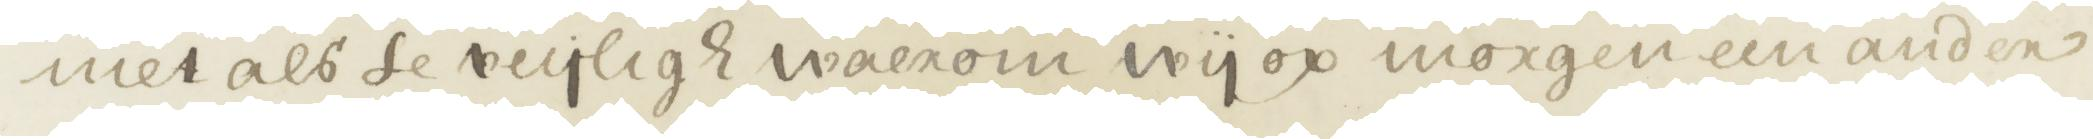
niet als te veijligh waerom wij op morgen een ander
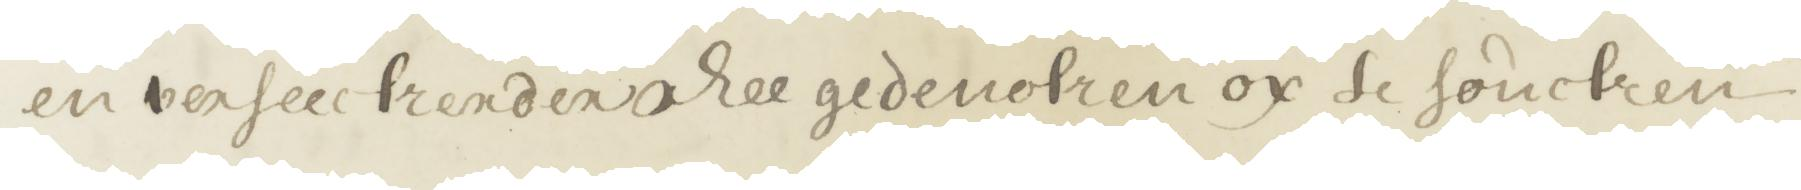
en verseeckerder rhee gedenoken op te soucken
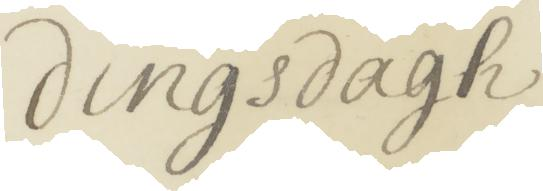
dingsdagh
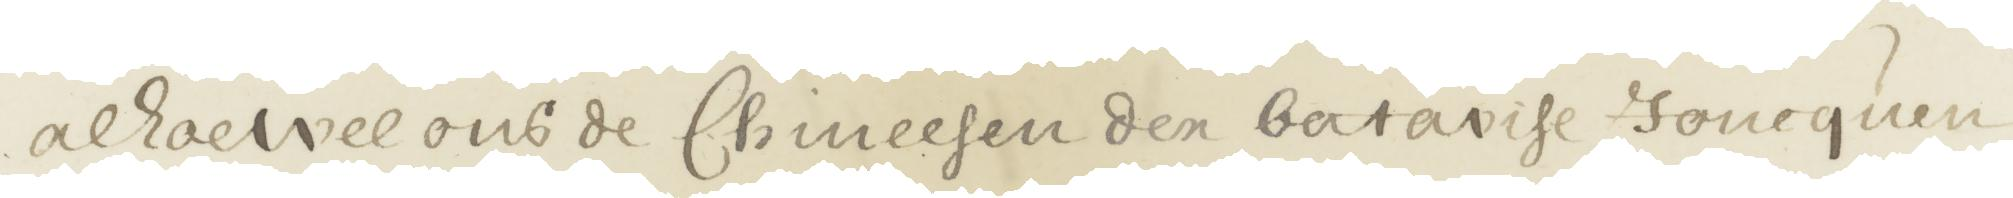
alhoewel ons de Chineesen der batavise Joncquen
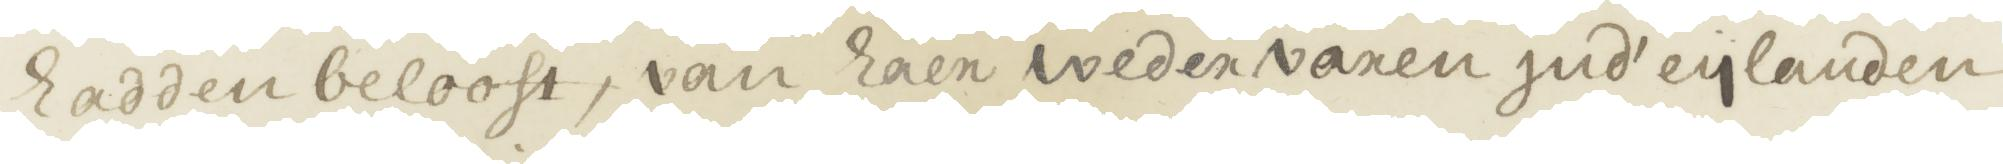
hadden belooft, van haer weder varen jnd' eijlanden
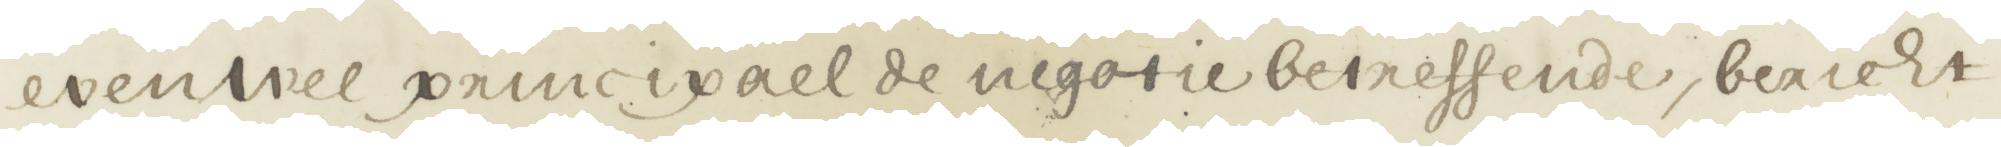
evenwel principael de negotie betreffende, bericht
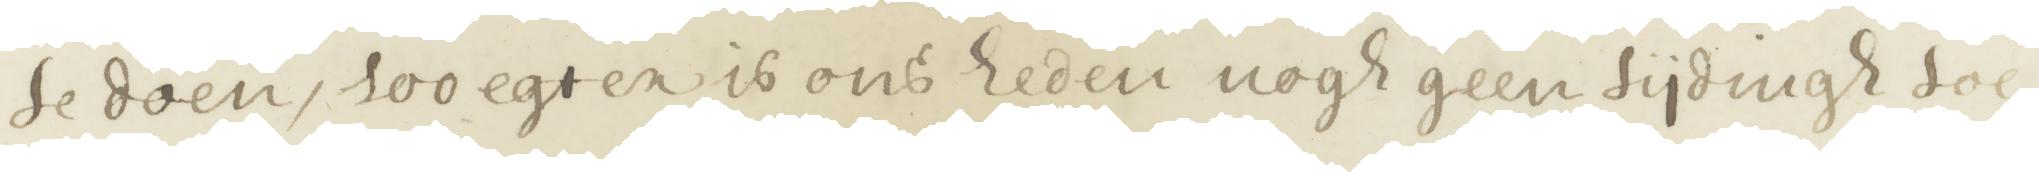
te doen, soo egter is ons heden nogh geen tijdingh toe
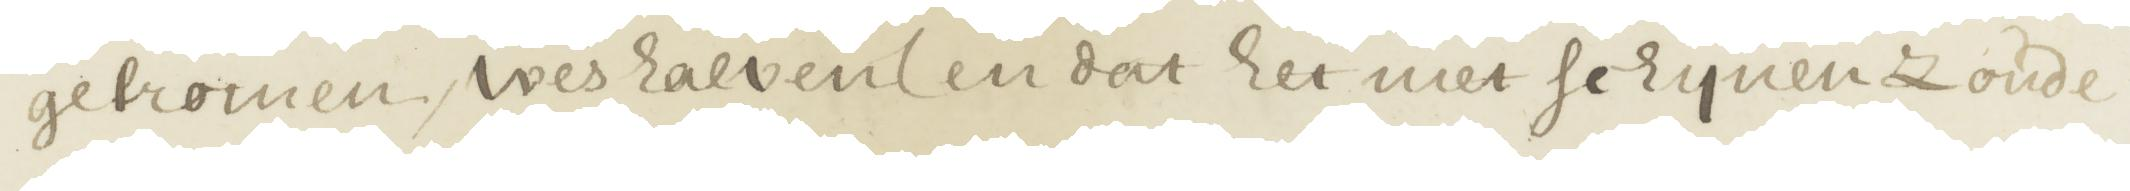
gekomen, wes halven (en dat het niet schijnen zoude
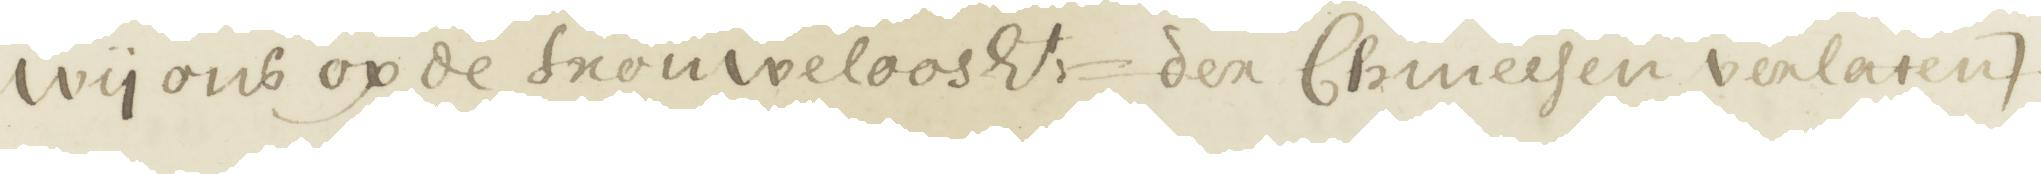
wij ons op de trouweloosh:=t der Chineesen verlaten)
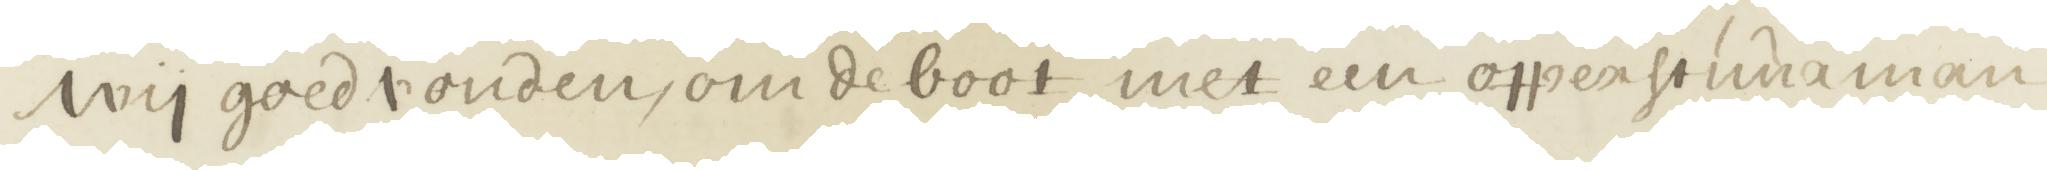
wij goedvonden, om de boot met een opperstuurman
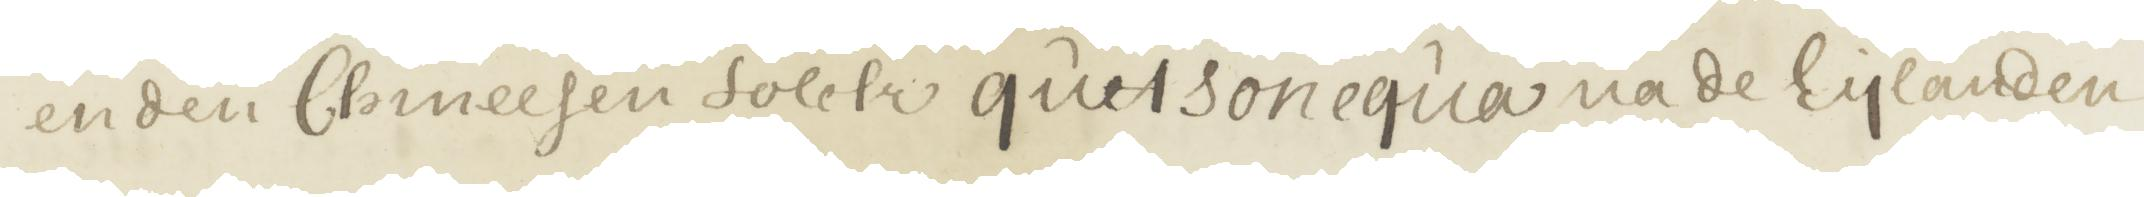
en den Chineesen tolck quetsonequa na de Eijlanden
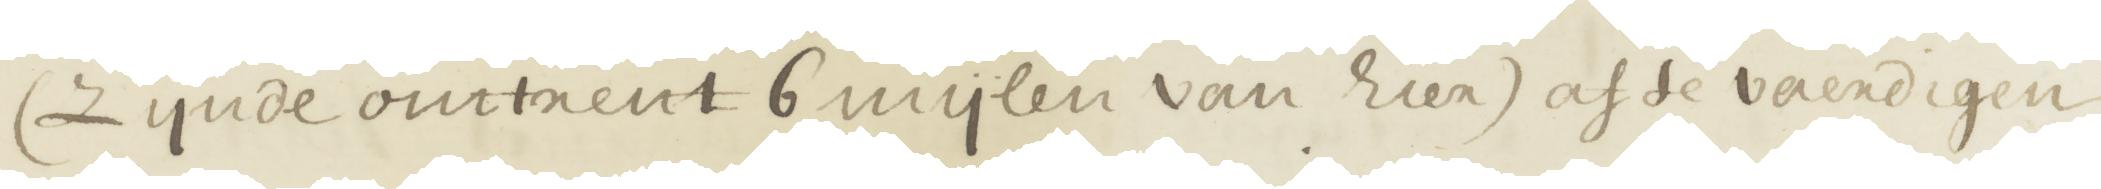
(zynde omtrent 6 mijlen van hier) afte vaerdigen
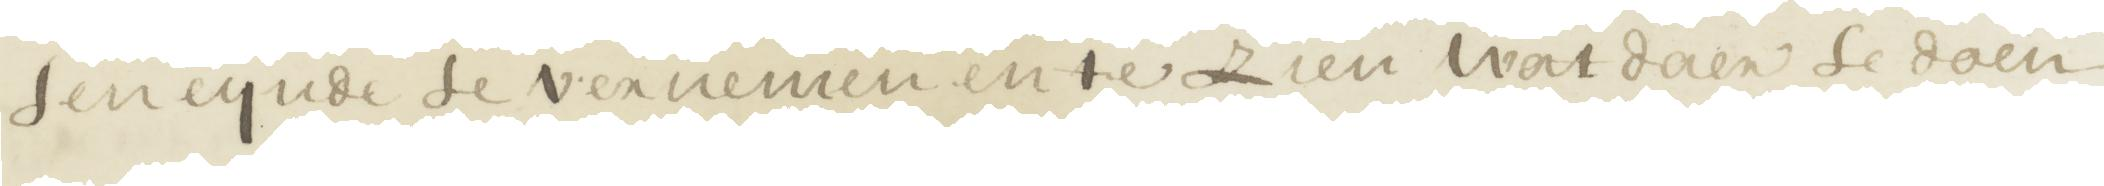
ten eijnde te vernemen en te zien wat daer te doen
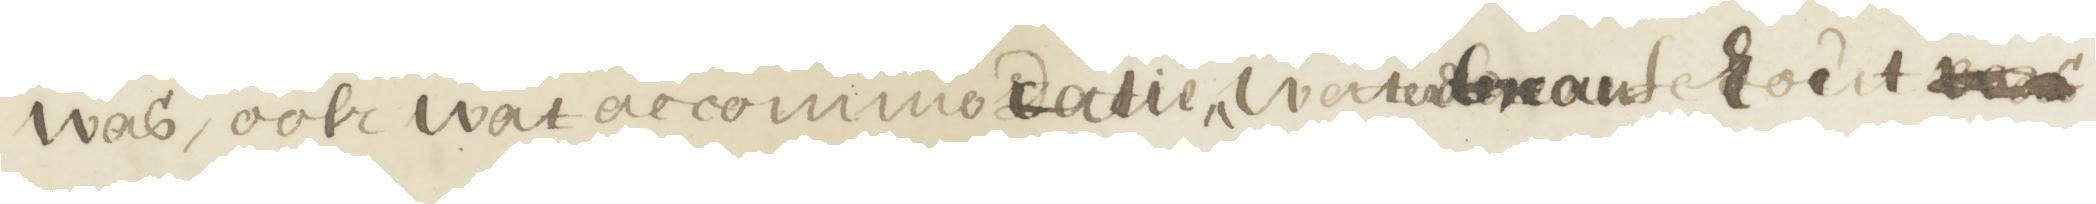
was, ook wat accommodatie ^ wat er brante hout vas
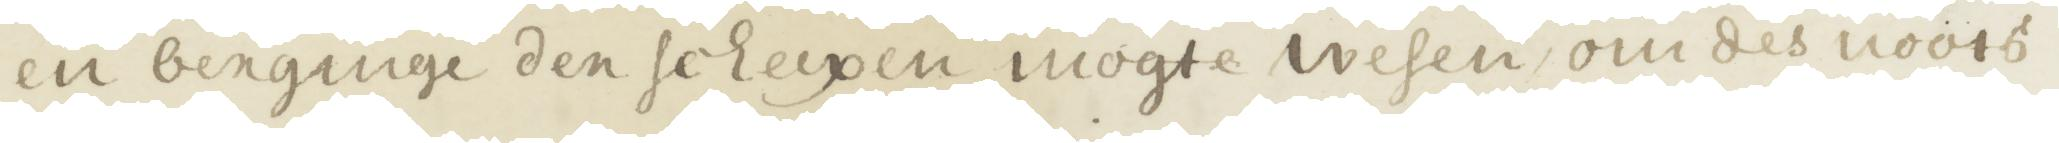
en berginge der scheepen mogte wesen, om des noots
